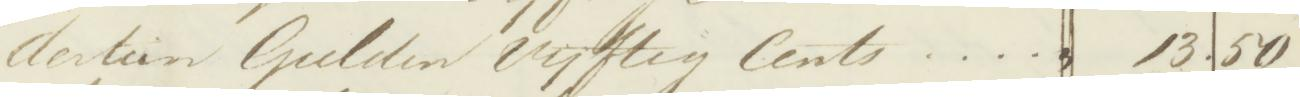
dertien Gulden vijftig Cents . . . . „ 13.50
